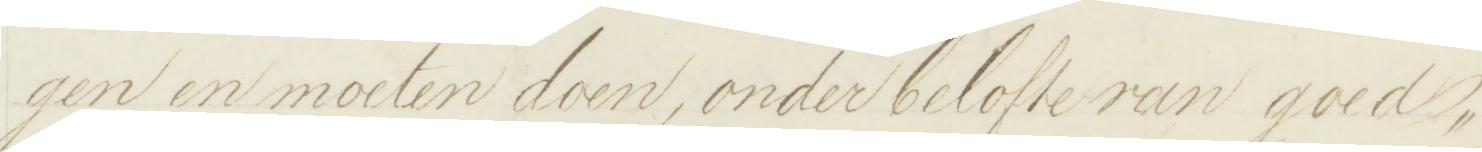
gen en moeten doen, onder belofte van goed„
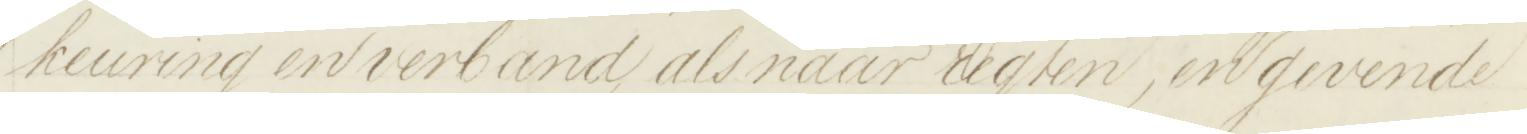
keuring en verband, als naar regten, en gevende
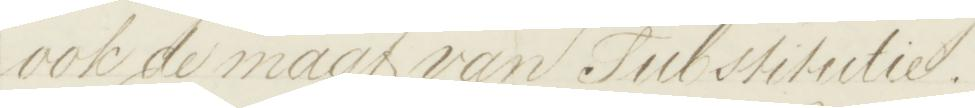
ook de magt van Substitutie.
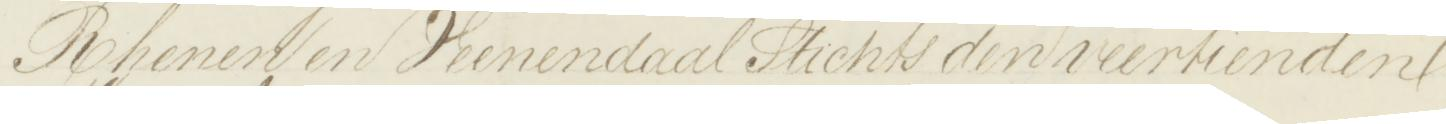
Rhenen en Veenendaal Stichts den veertienden
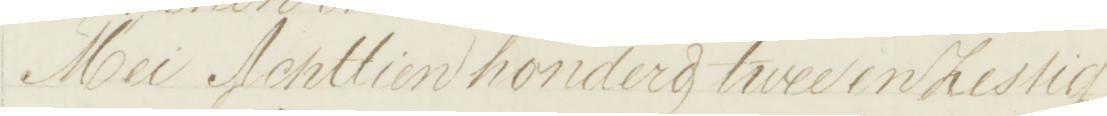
Mei Achttien honderd twee en Zestig
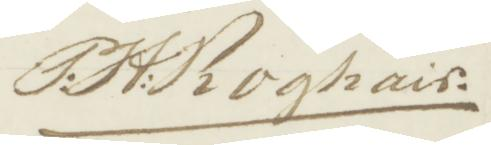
P:H: Roghair.
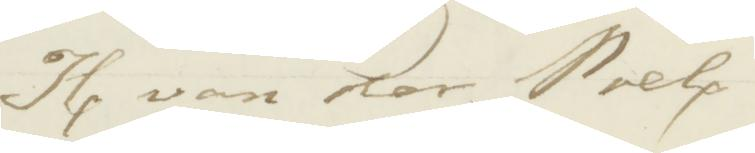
H van der Poel
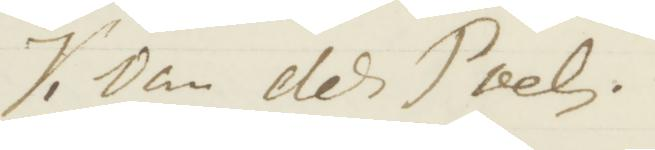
K. van der Poel.
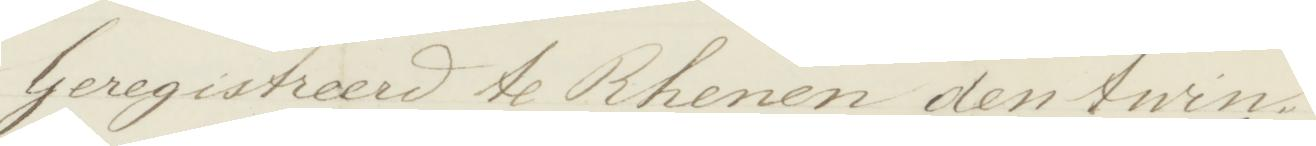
Geregistreerd te Rhenen den twin„
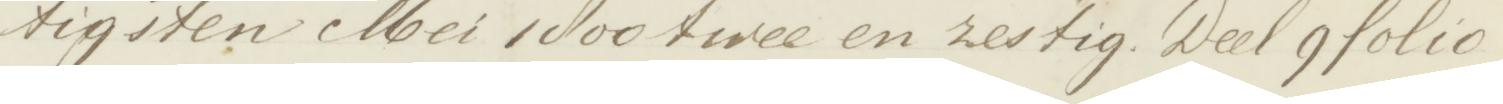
tigsten Mei 1800 twee en zestig. Deel 9 folio
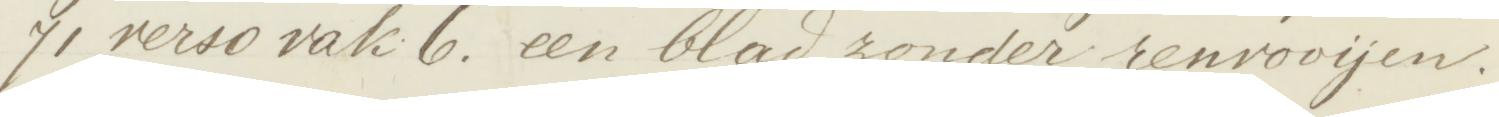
71 verso vak 6. een blad zonder renvooijen.
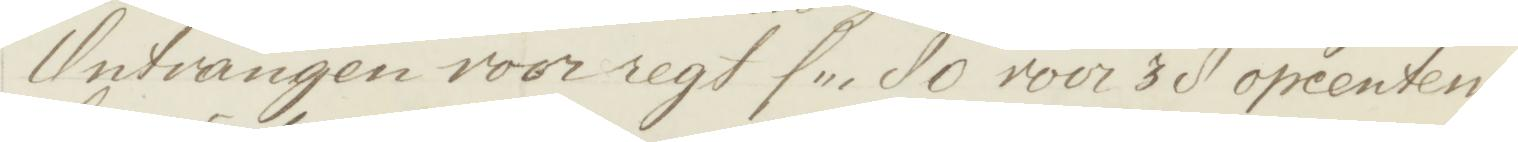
Ontvangen voor regt ƒ„ ,80 voor 38 opcenten
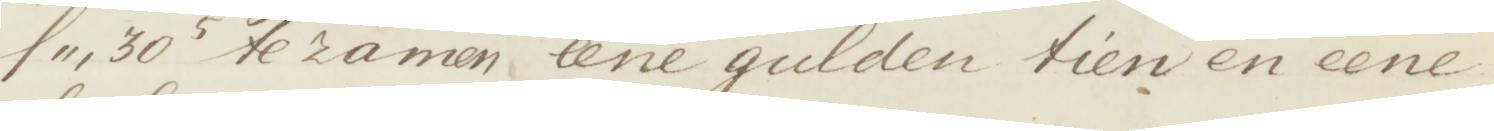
ƒo„ , 305 tezamen eene gulden tien en eene
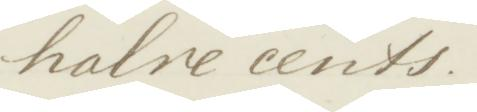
halve cents.
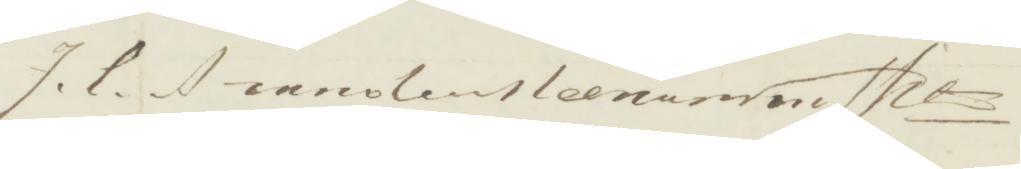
J: C. A vanderMeervanKuffeler
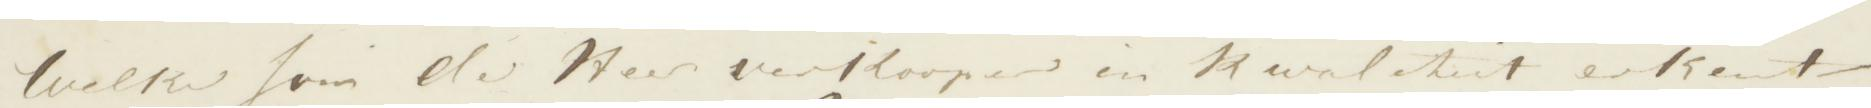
welke Jan de Heer verkooper in Kwaliteit erkent
